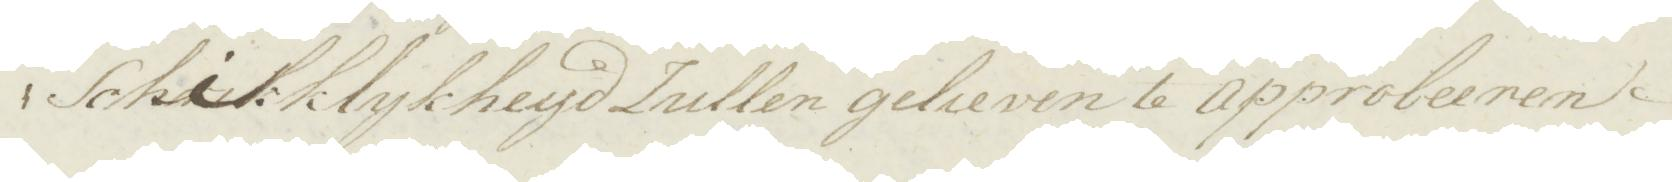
„Schikklykheyd Zullen gelieven te approbeeren -
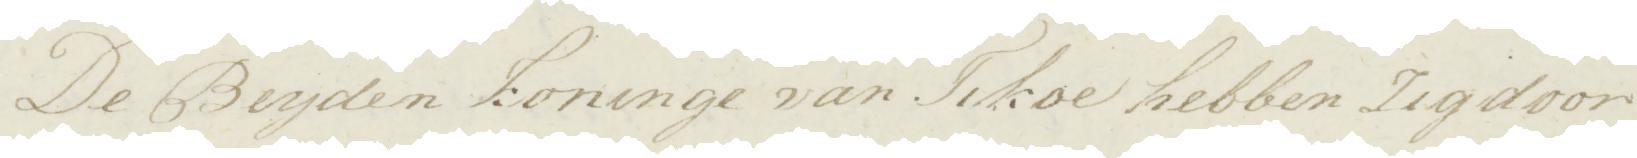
De Beyden koninge van Tikoe hebben Zig door
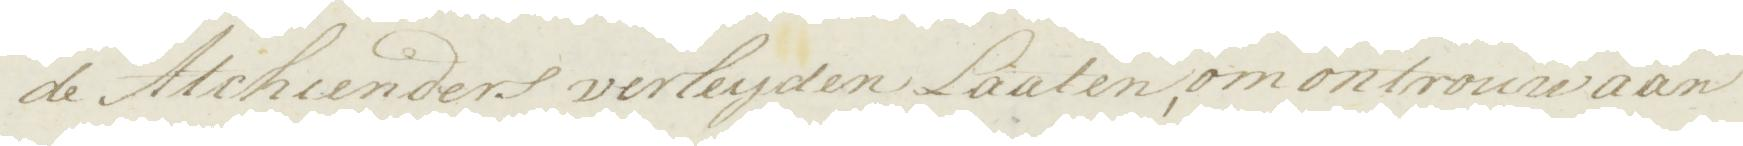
de Atchienders verleyden Laaten, om ontrouw aan
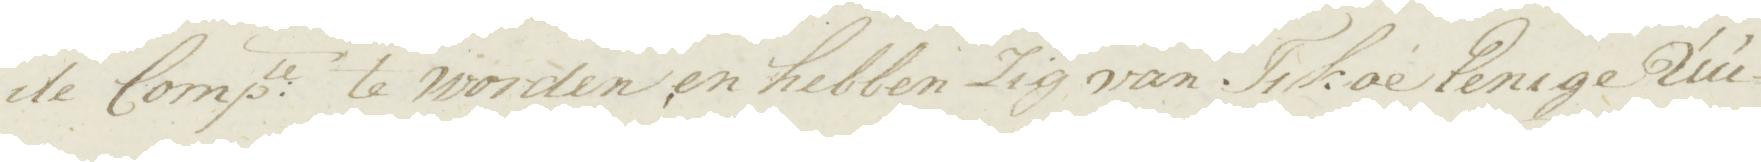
de Comp:ie te worden, en hebben Zig van Tikoe Eenige Uu
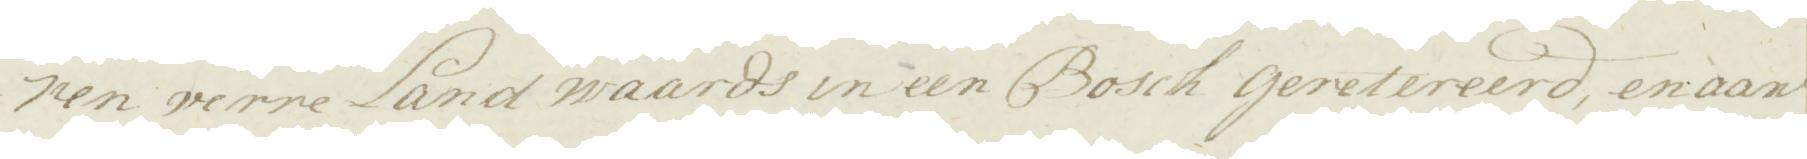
=ren verre Land waards in een Bosch geretereerd, en aan
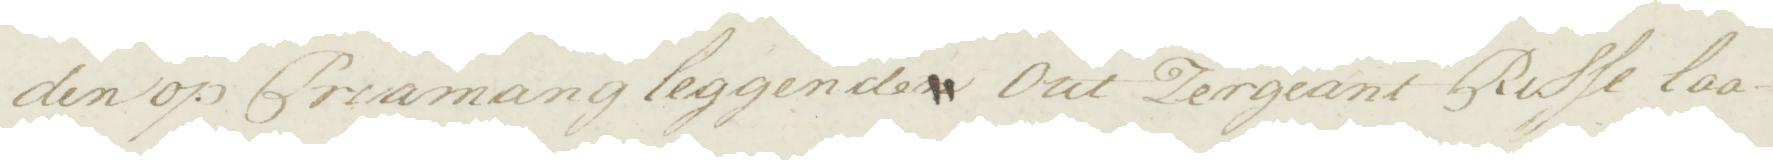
den op Priamang leggenden Out Zergeant Risse laa=
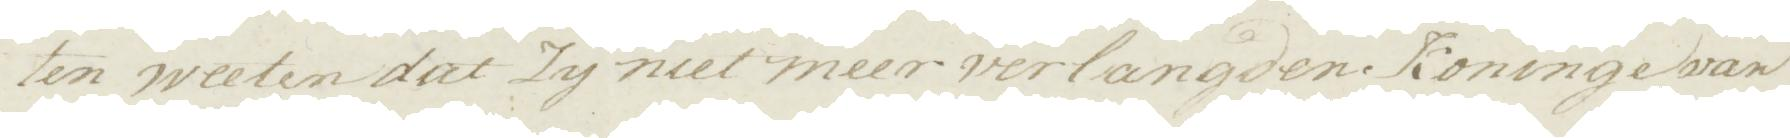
ten weeten dat Zy niet meer verlangden Koninge van
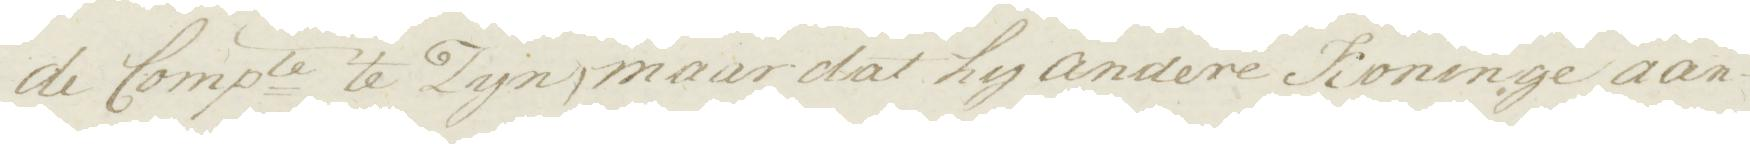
de Comp=ie te Zyn, maar dat hy andere Koninge aan
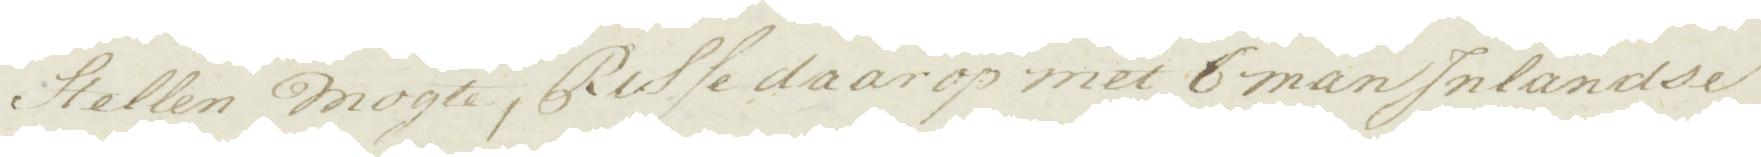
Stellen mogte, Risse daar op met 6 man Jnlandse
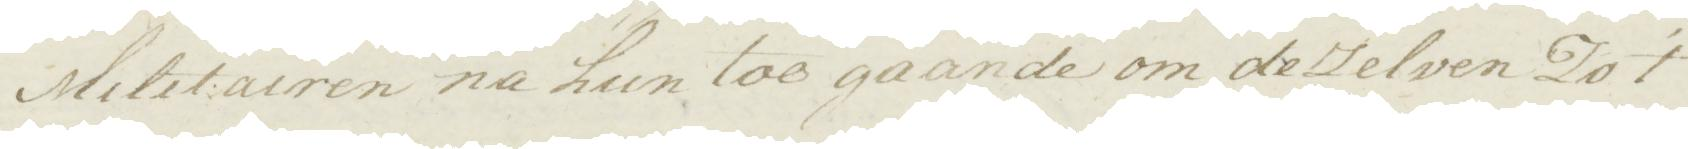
Militairen na hun toe gaande om dezelven Zo 't
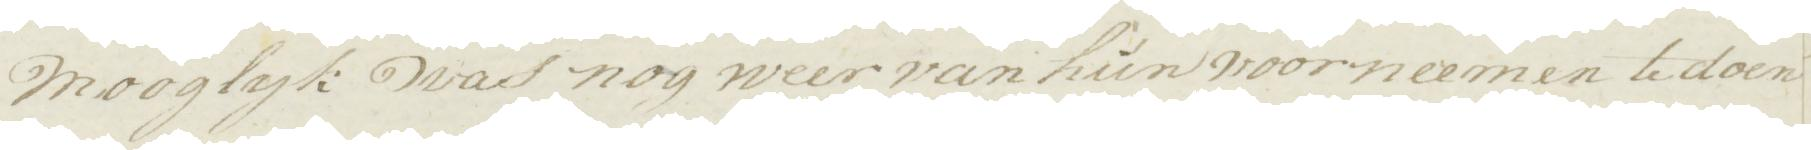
mooglyk was nog weer van hun voorneemen te doen
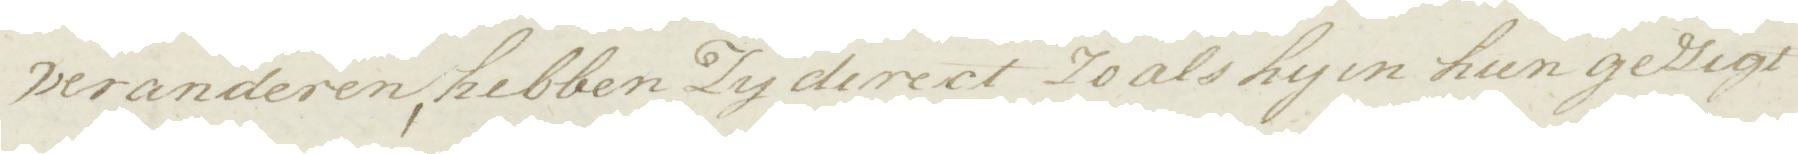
veranderen, hebben Zy direct zo als hy in hun gezigt
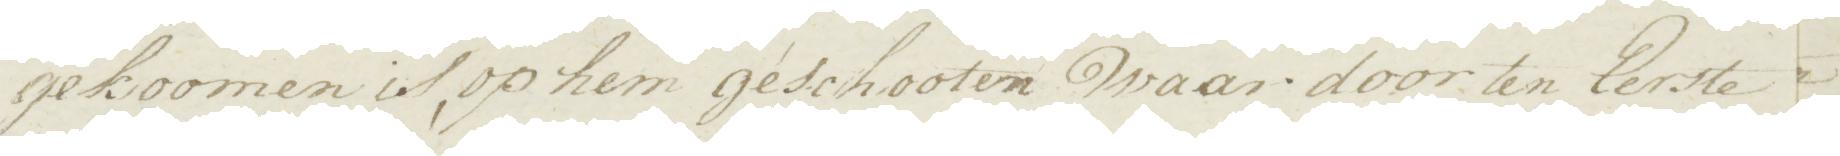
gekoomen is, op hem geschooten waar door ten Eerste
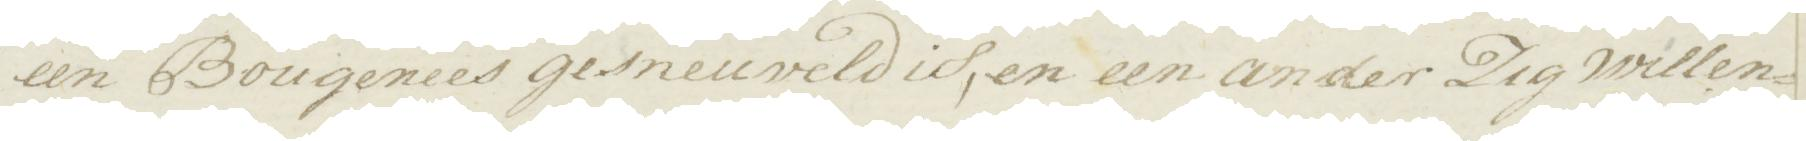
een Bougenees gesneuveld is, en een an der Zig willen=
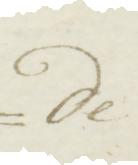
= de
